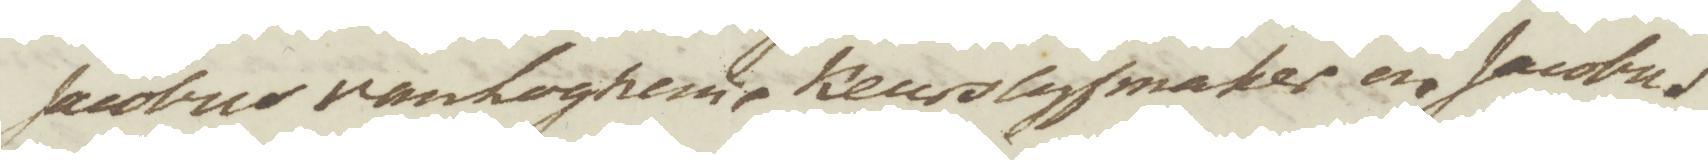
Jacobus van Loghem, Keurslyfmaker en Jacobus
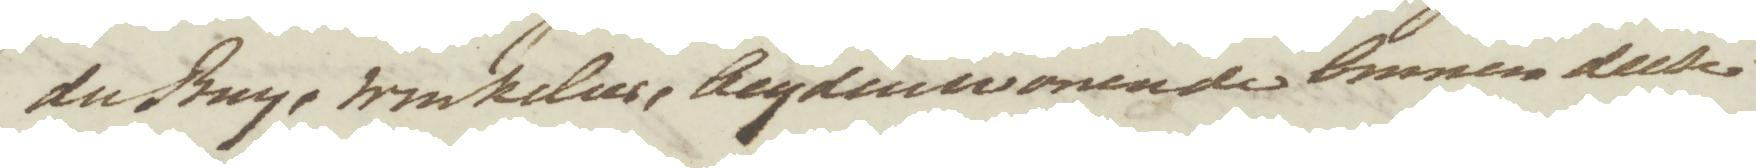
du Buy, winkelier, beijden wonende binnen deese
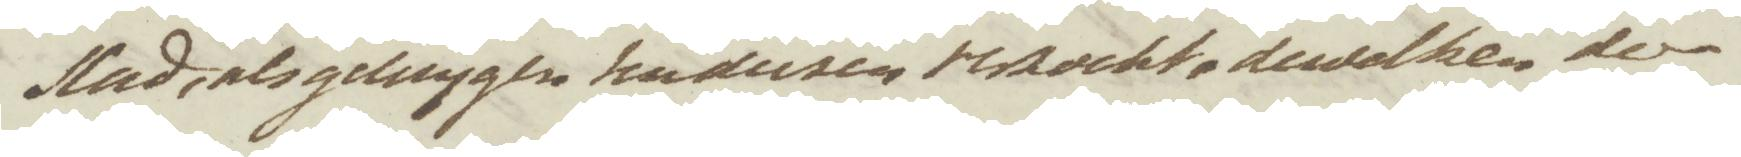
stad, als getuijgen ten deesen verzocht, dewelken de
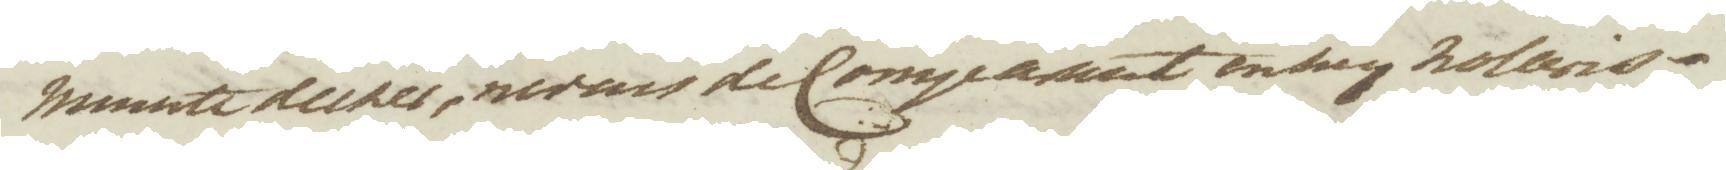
minute deezes, nevens de Comparant en my notaris
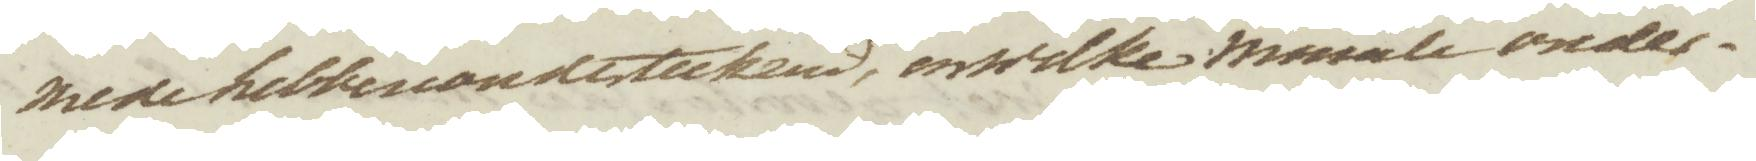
mede hebben onderteekend, en welke minute onder
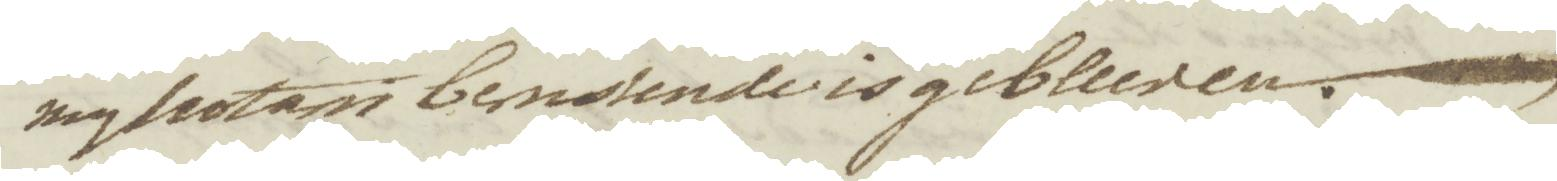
my notaris berustende is gebleeven.
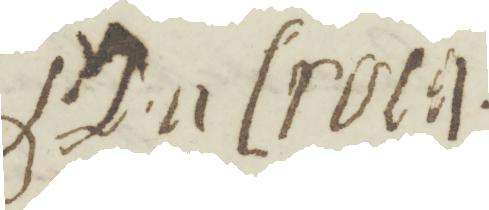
PJ. v Crom.
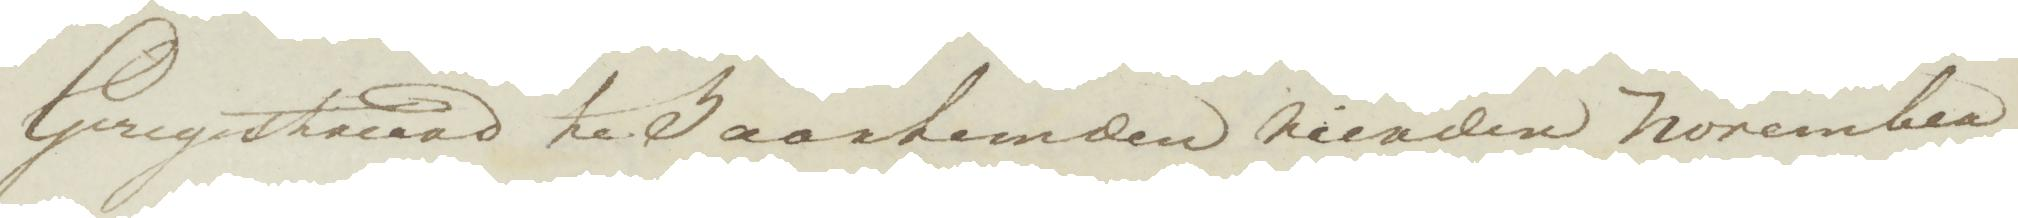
Geregistreerd te Haarlem den vierden November
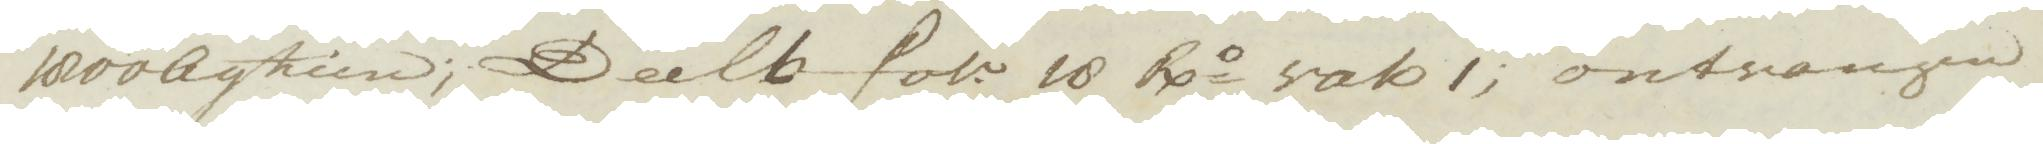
1800 agtien; Deelb fol.o 18 R=o vak 1; onvangen
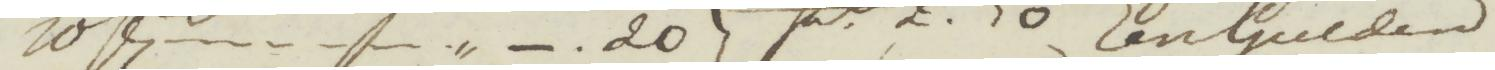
20 pr=t - - - - - -„ -.20 fol.o 2.50 Een Gulden
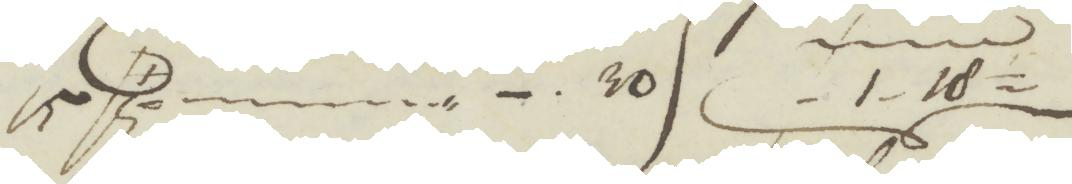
15 pr=t - - - - - - -„ -.30 - 1 - 18 ½
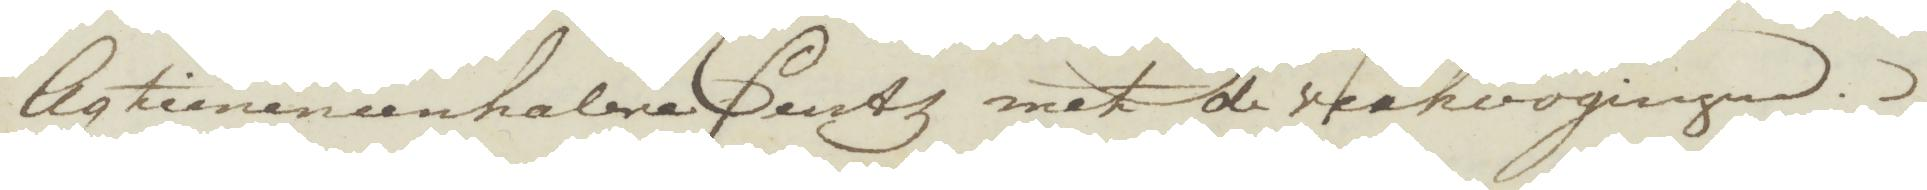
Agtienen een halve Centz met de verhoogingen. )
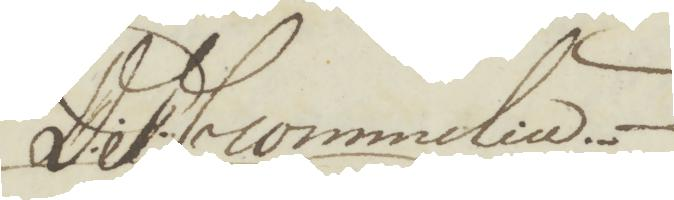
D: S: Crommelin. .
